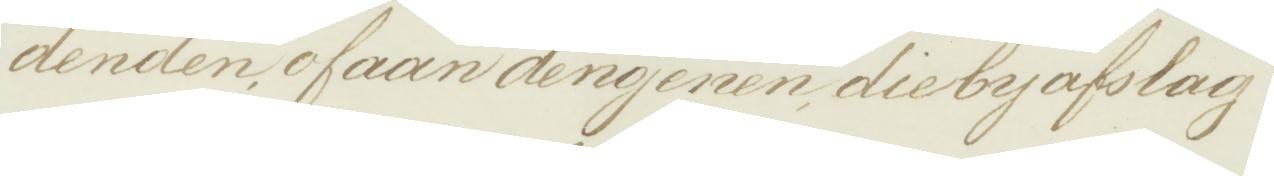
denden, of aan dengenen, die by afslag
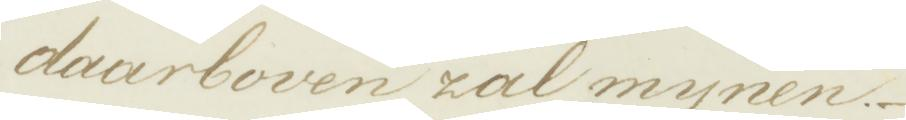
daarboven zal mynen.
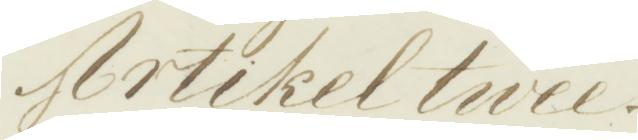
Artikel twee
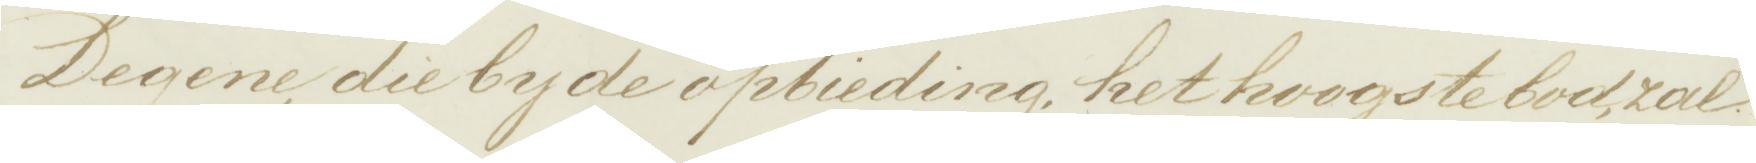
Degene die by de opbieding, het hoogste bod, zal.
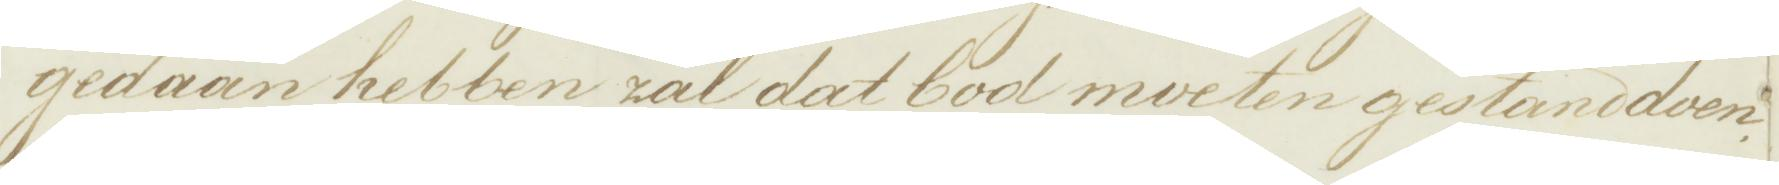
gedaan hebben, zal dat bod moeten gestand doen,
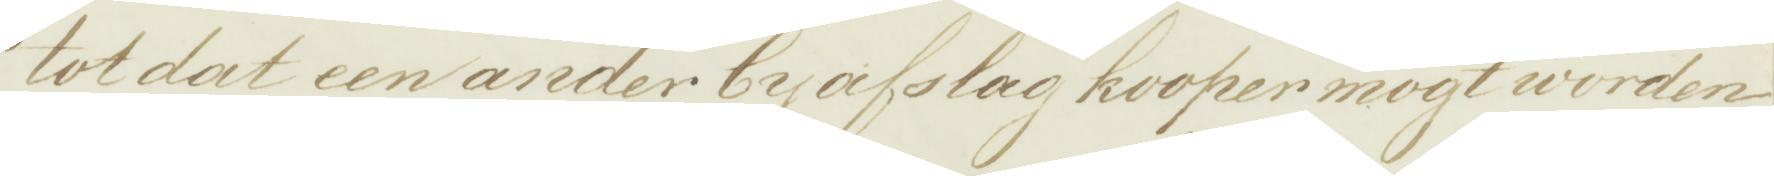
tot dat een ander by afslag kooper mogt worden
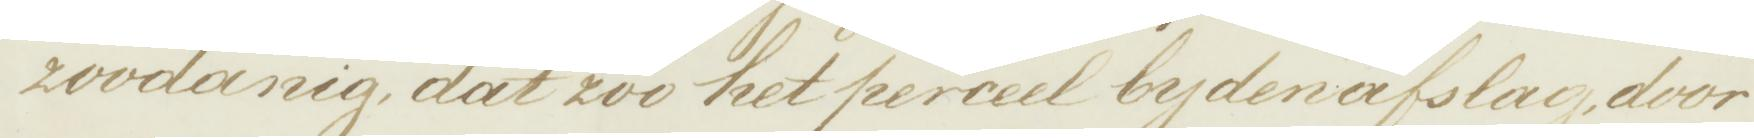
zoodanig, dat zoo het perceel by den afslag, door
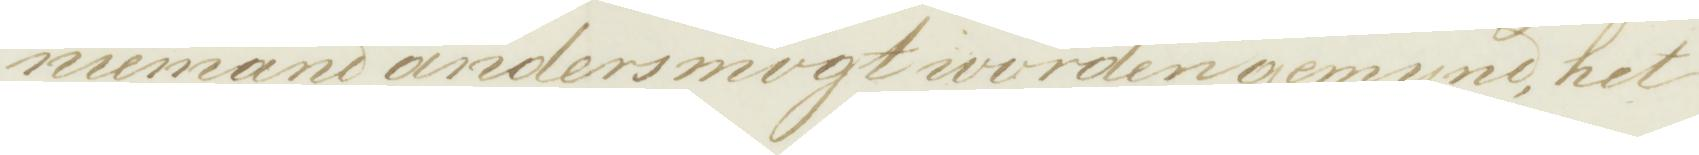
niemand anders mogt worden gemynd, het
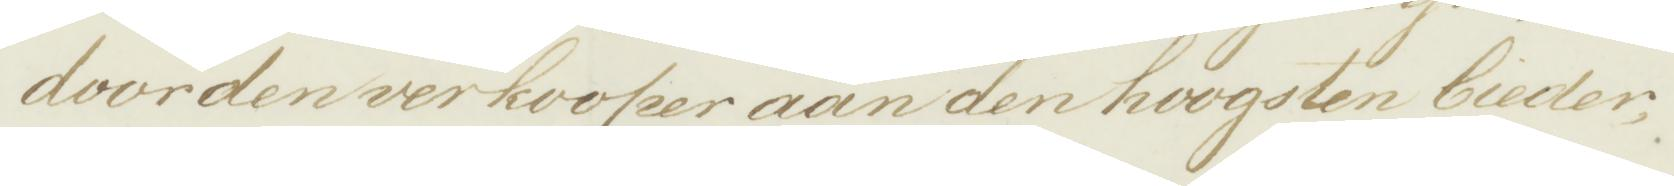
door den verkooper aan den hoogsten bieder,
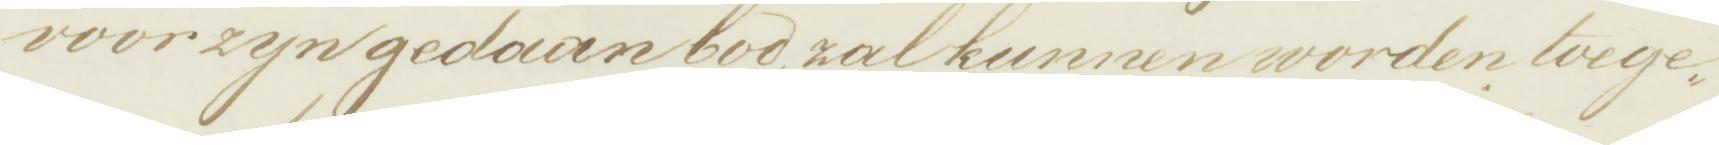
voor zyn gedaan bod, zal kunnen worden toege„
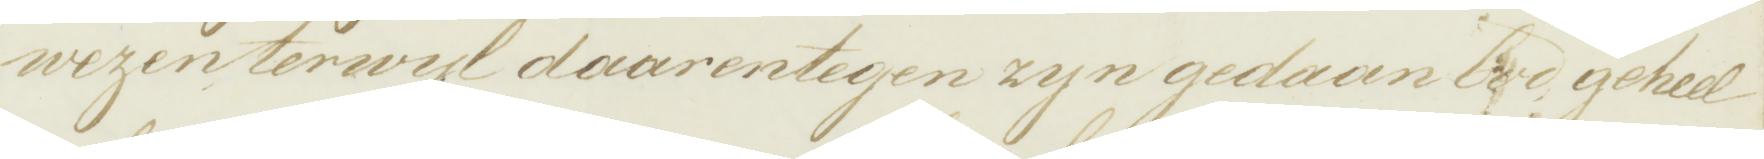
wezen terwyl daar en tegen zijn gedaan bod, geheel
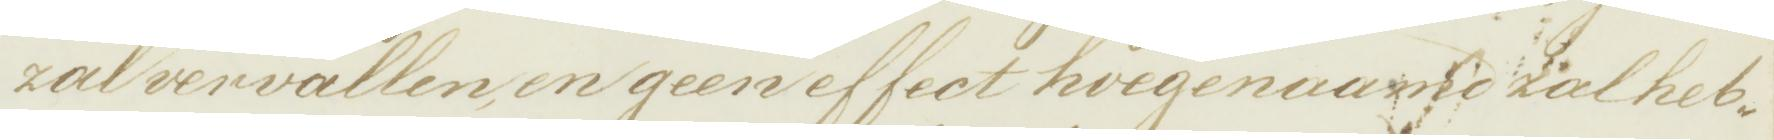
zal vervallen, en geen effect hoegenaamd zal heb„
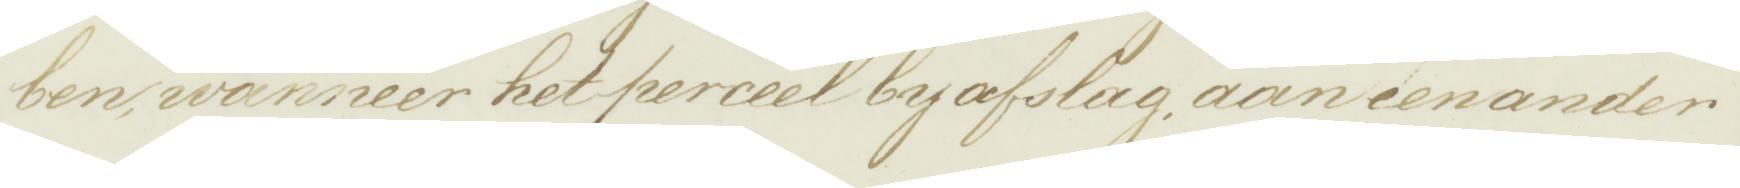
ben, wanneer het perceel by afslag, aan een ander
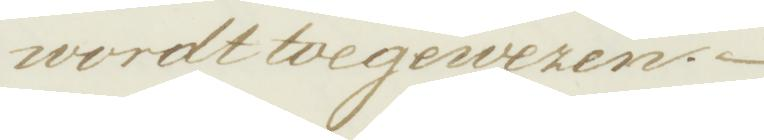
wordt toegewezen.—
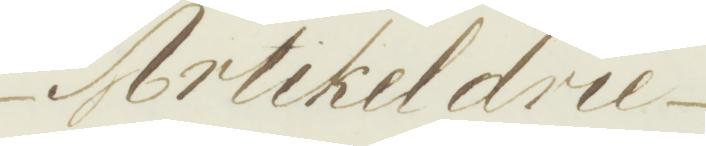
Artikel drie-
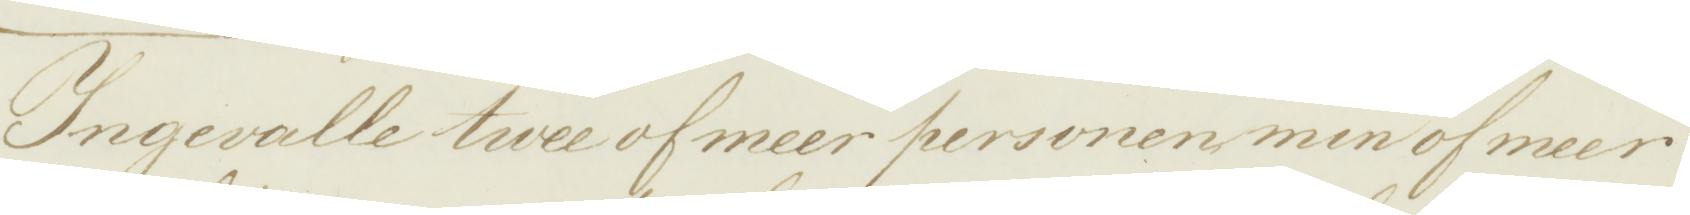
Ingevalle twee of meer personen min of meer
